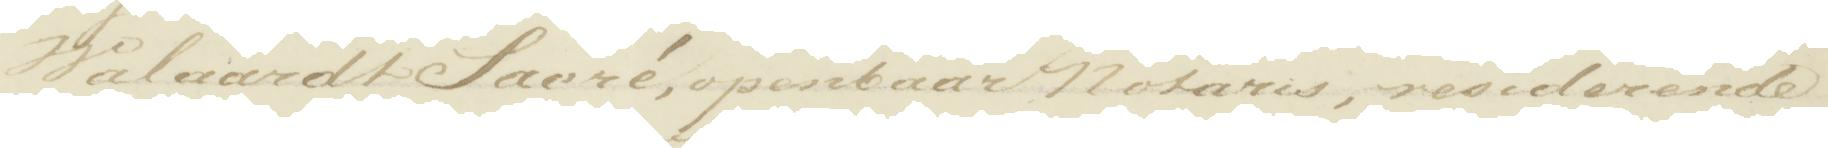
Walaardt Sacré, openbaar Notaris, residerende
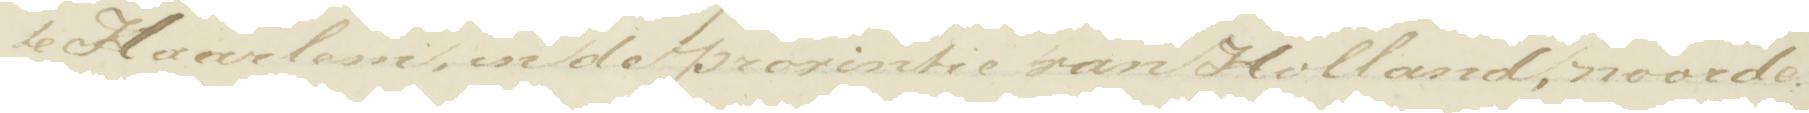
te Haarlem, in de provintie van Holland, noorde„
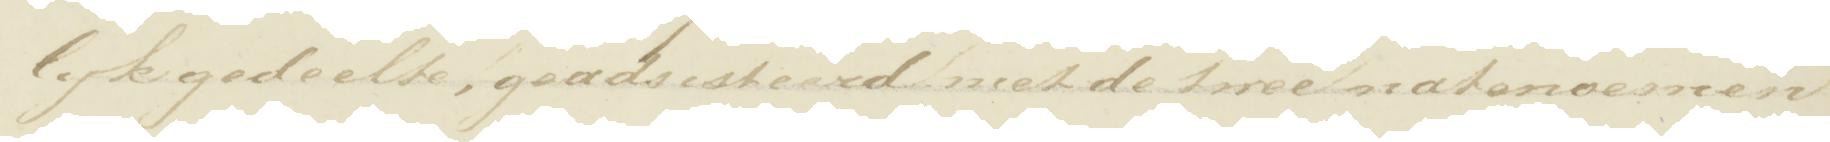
lyk gedeelte, geadsisteerd niet de twee na te noemen
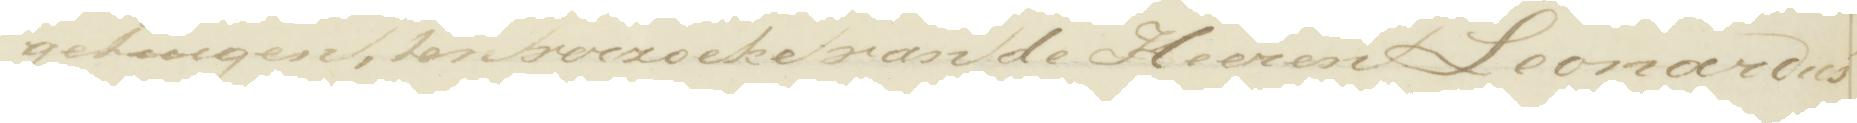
getuigen, ten verzoeke van de Heeren Leonardus
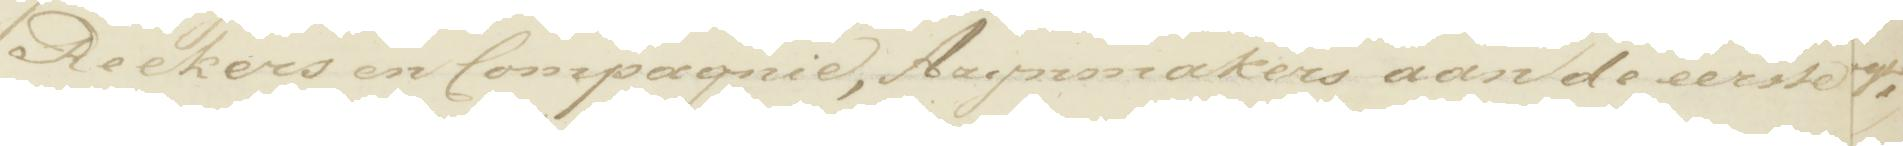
Reekers en Compagnie, Azynmakers aan de eerste „
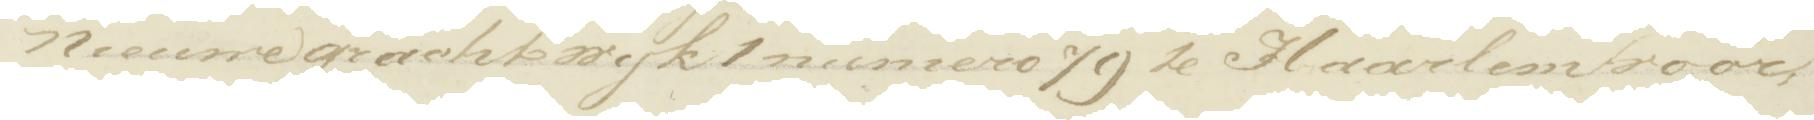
nieuwe gracht Wyk 1 numero 79 te Haarlem voor„
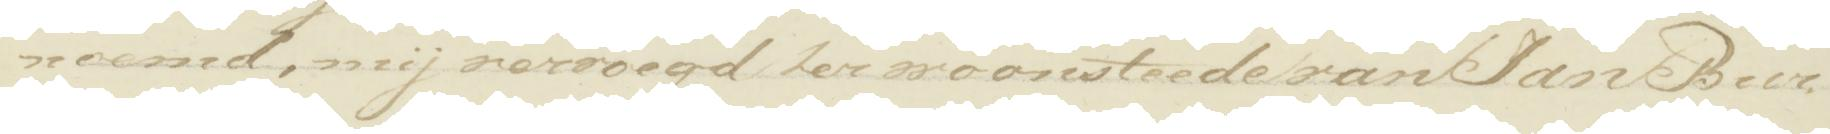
noemd, mij vervoegd ter woonsteede van Jan Bur
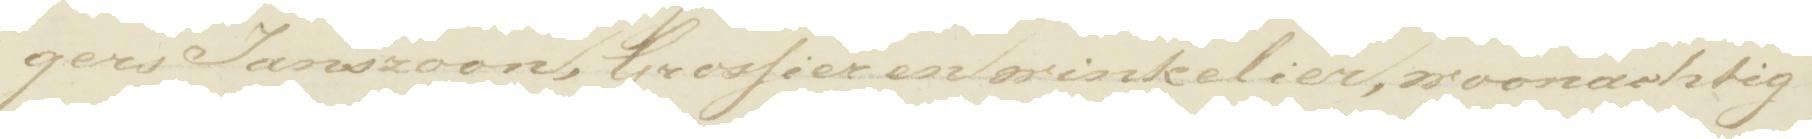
gers Janszoon, Grossier en winkelier, woonachtig
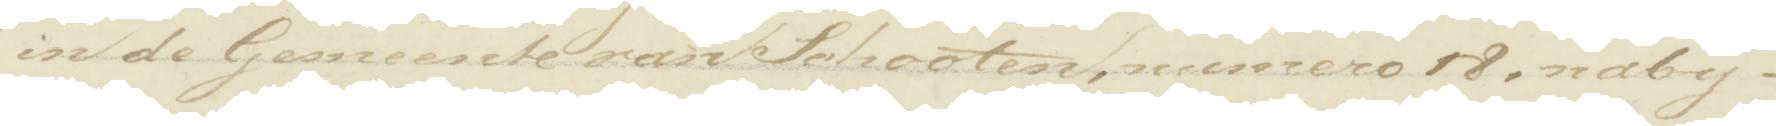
in de Gemeente van Schooten numero 18, naby
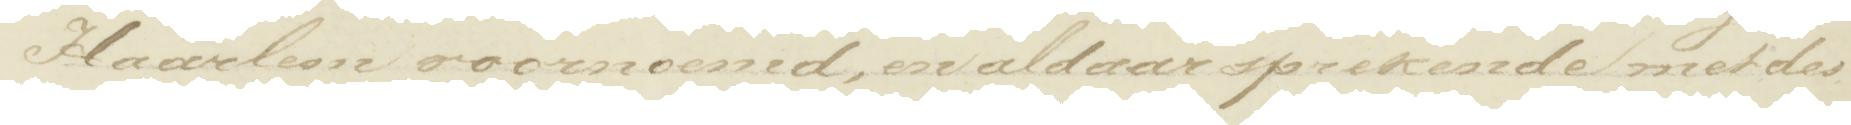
Haarlem voornoemd, en aldaar sprekende met des
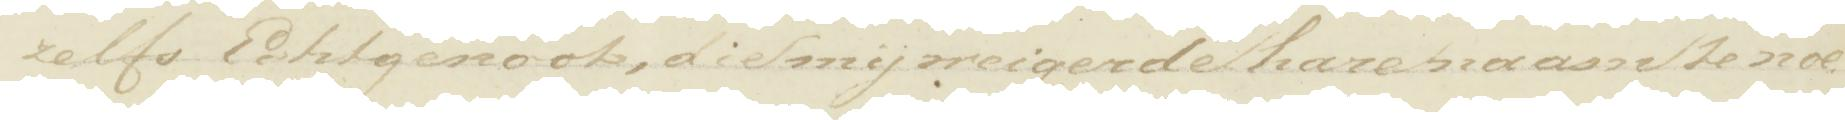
zelfs Echtgenoot, die mij weiger de hare naam te noe
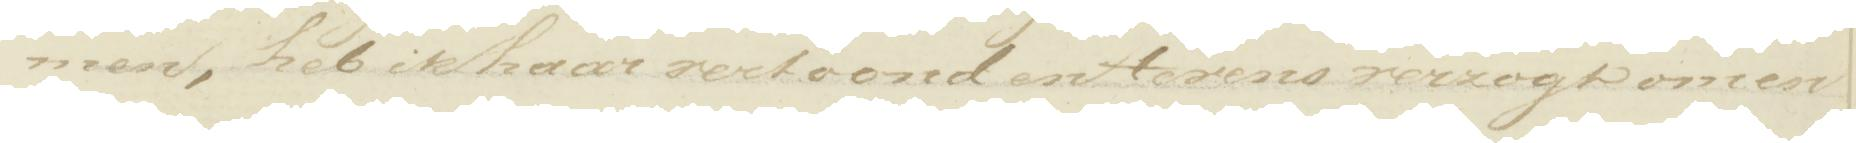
men, heb ik haar vertoond en tevens verzogt om en
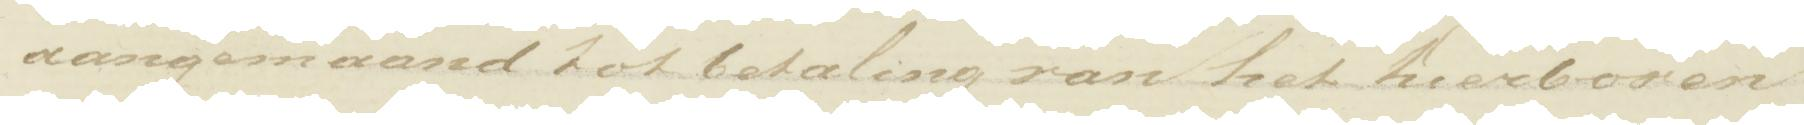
aangemaand tot betaling van het hierboven
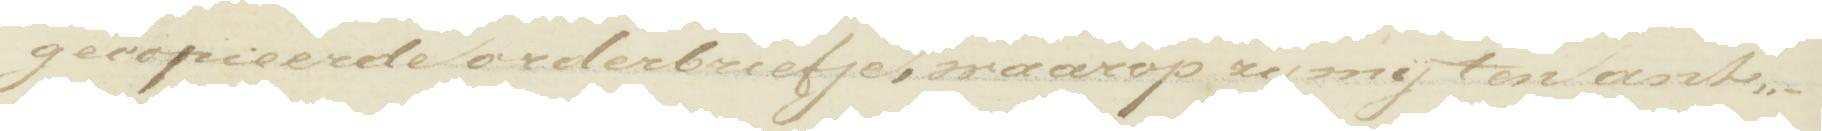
gecopieerde order briefje waarop zy mij ten ant
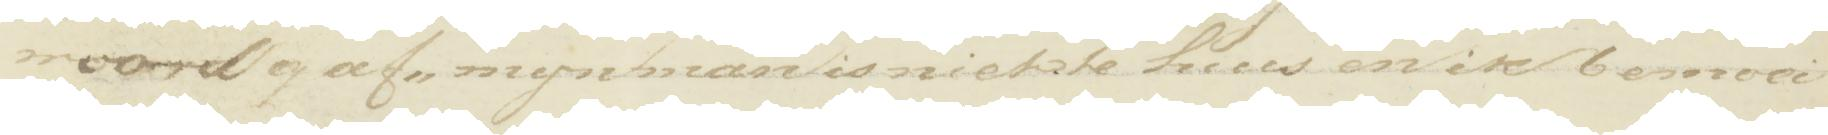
woord gaf myn man is niet te huis en ik bemoei
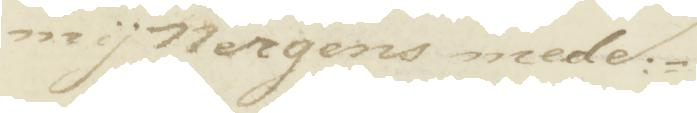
mij Nergens mede:-
